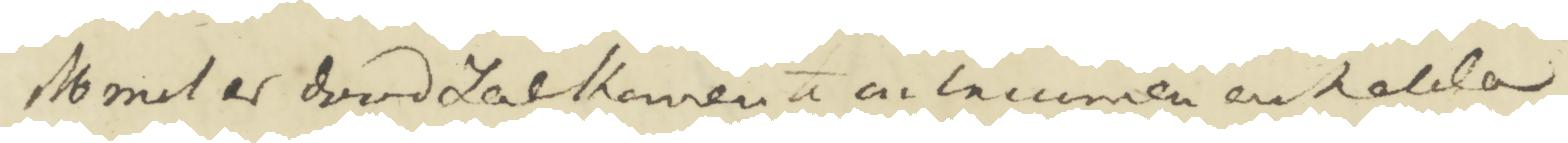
Als met er dood zal komen te ontruimen en natela
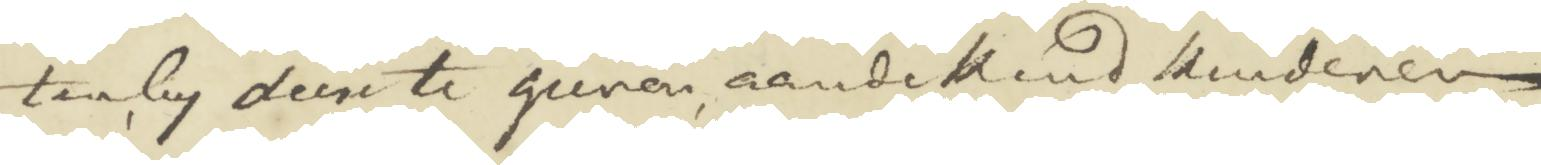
ten, bij deese te geeven, aan de kind, kinderen
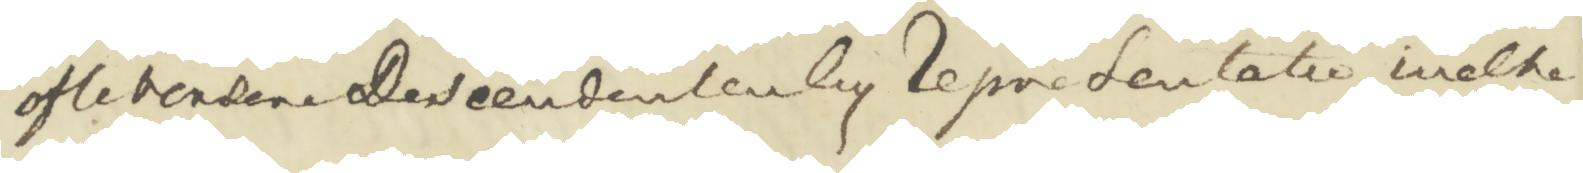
ofte verdere Descendenten by representatie, welke
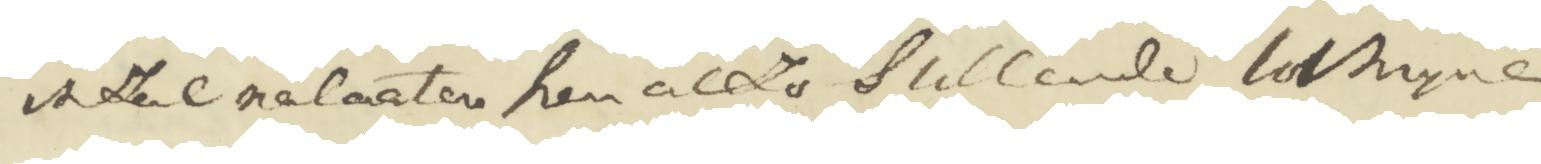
ik zal nalaaten hen alzo sullende tot myne
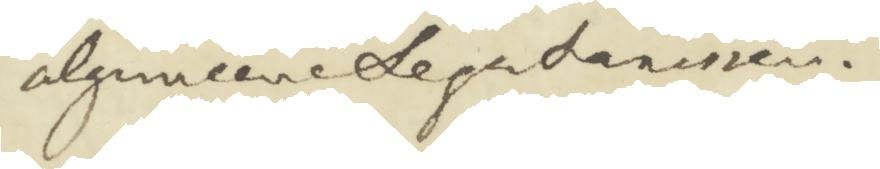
algemeene segen saneeren.
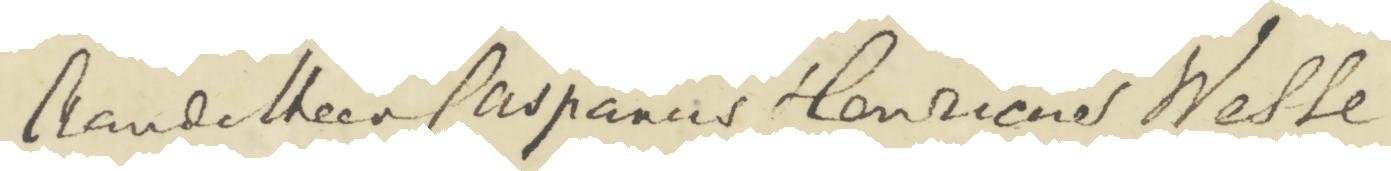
Aande Heer Casparus Henricus Wesse
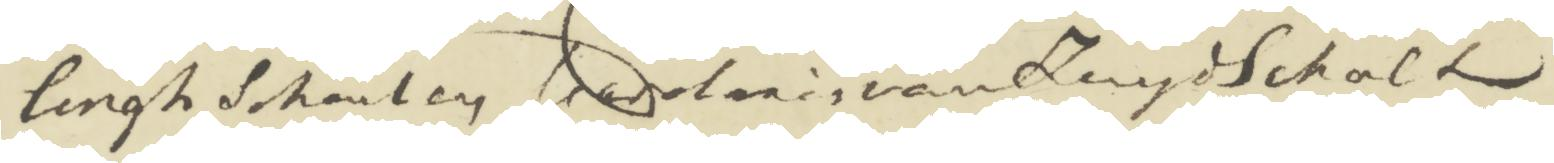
lingh, schout en Secretaris van Zuijdschalk
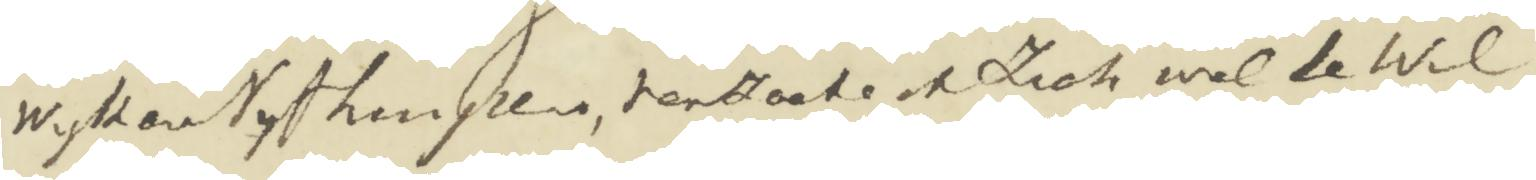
wyk en Vyfhuysen, verzoeke ik zich wel te wil
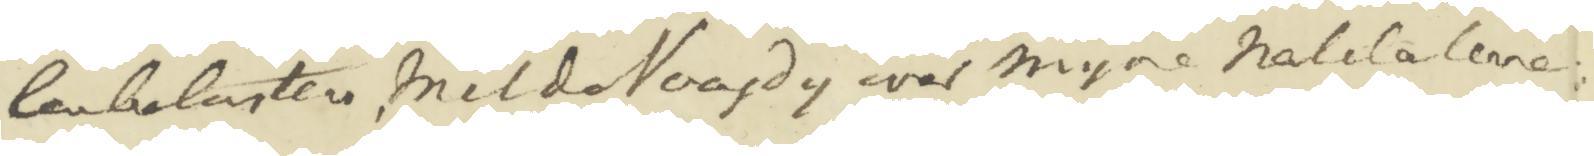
len belasten, met de Voogdij over mijne natelatene
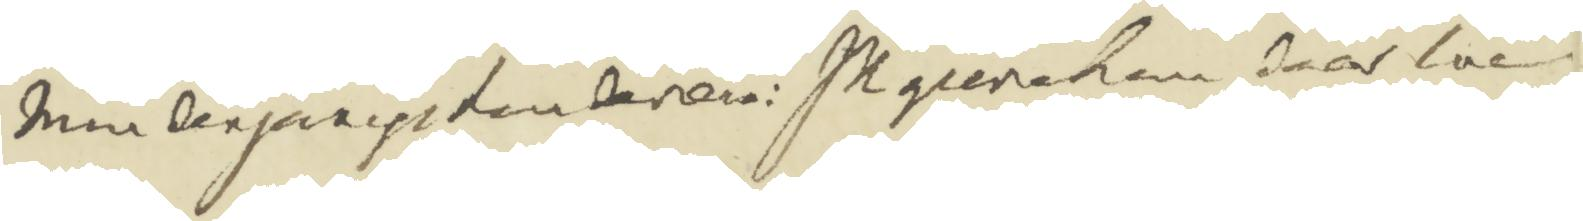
Minderjarige kinderen: Jk geeve hem daar toe
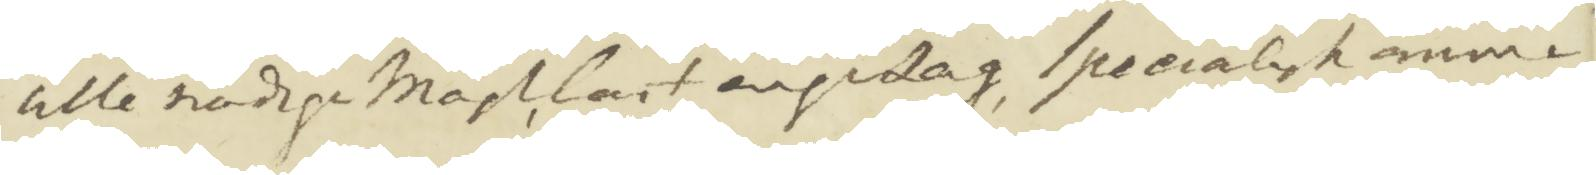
alle nodige Magt, last, en gesag, specialijk omme
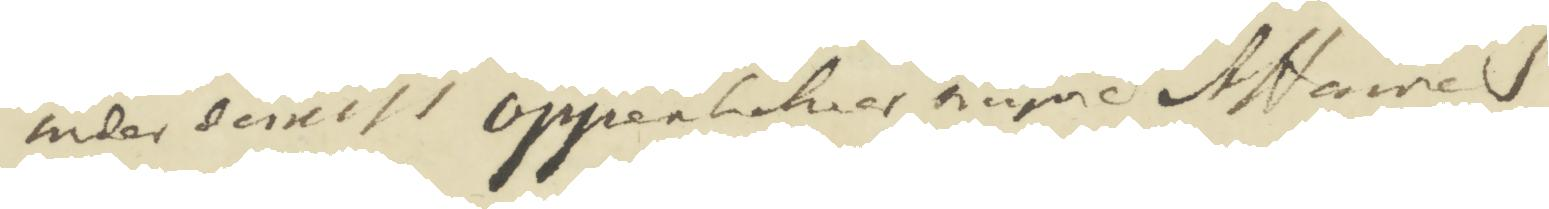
inder desselfs opper beheer, myne ttames
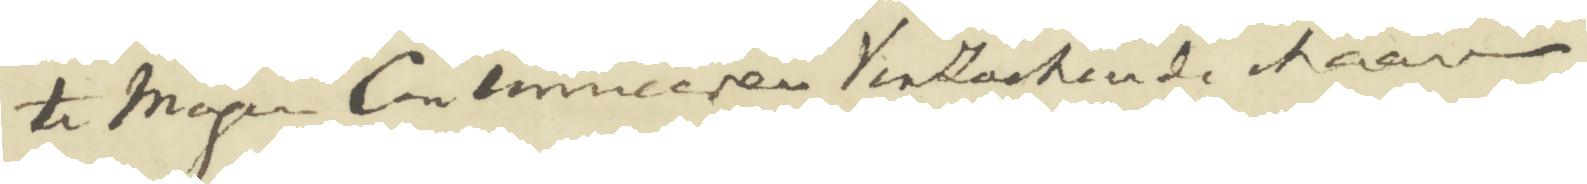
te Mogen Continueeren, verzoekende haar
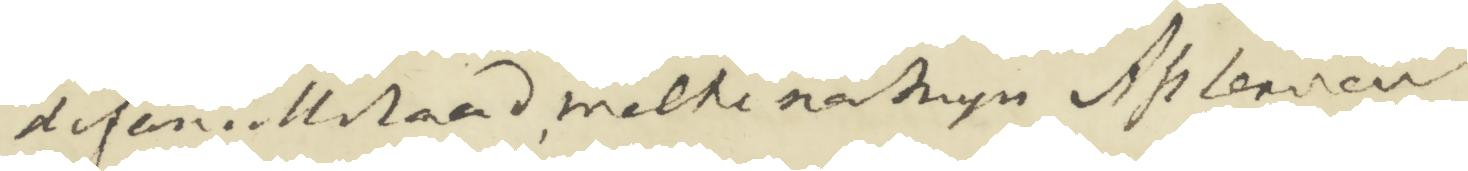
desen erfferaad, welke na mijn Afsterven
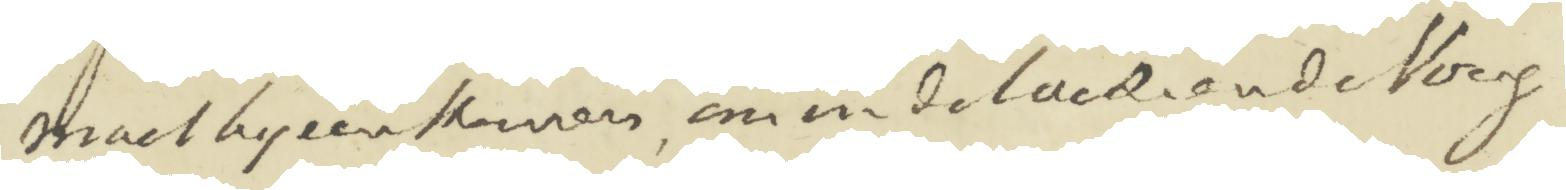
moet bijeen komen, om in de toeziende Voog
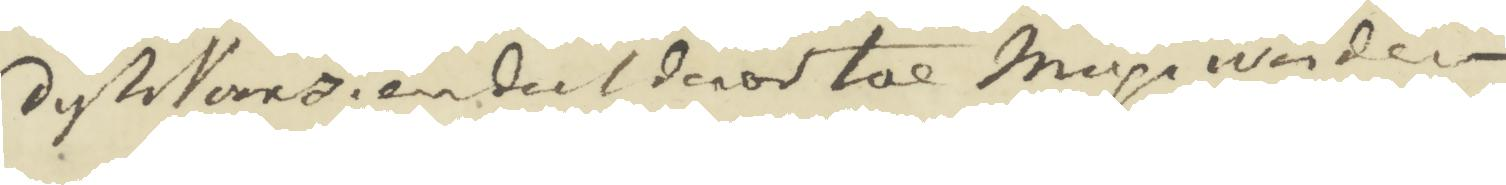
dy te Voorzien en dat daartoe Mogt worden
